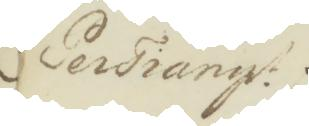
PerTransp:
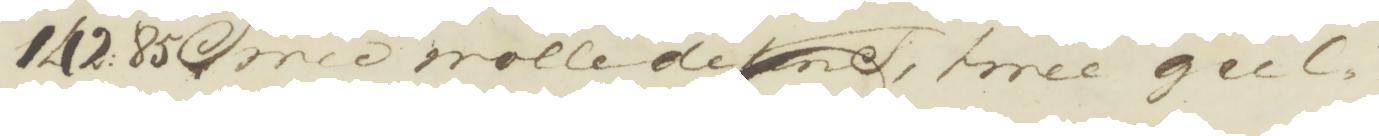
ƒ142:85 Twee wolle dekens, twee gul„
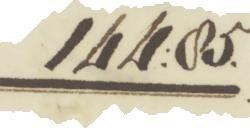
144:85.
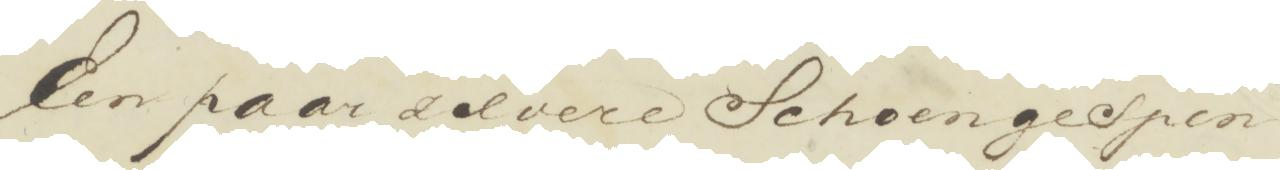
Een paar zilvere Schoengespen
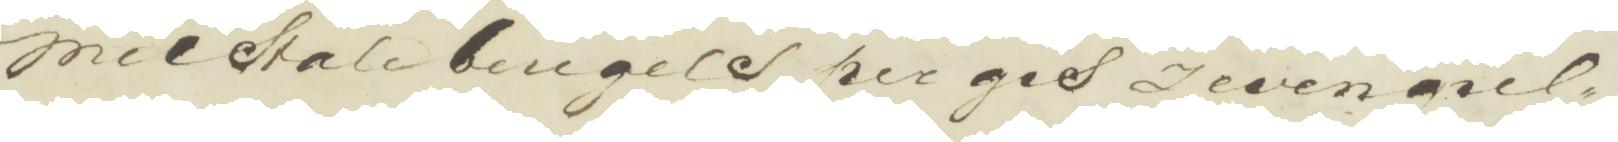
met stale beugels per ges zevengul„
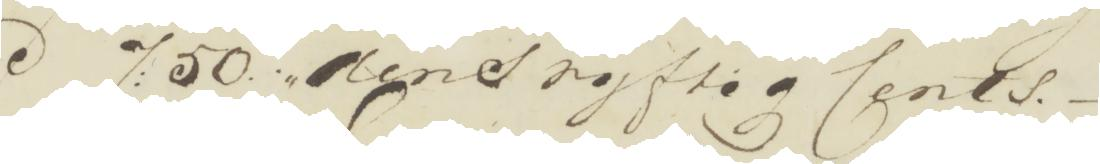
7: 50..„ dens vyftig Cents.-
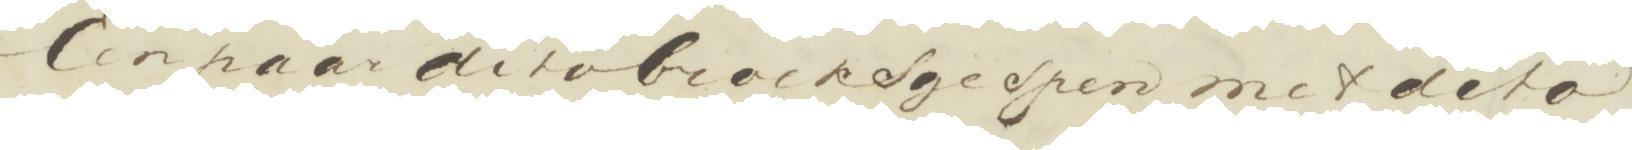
Een paar dito broeksgespen met dito
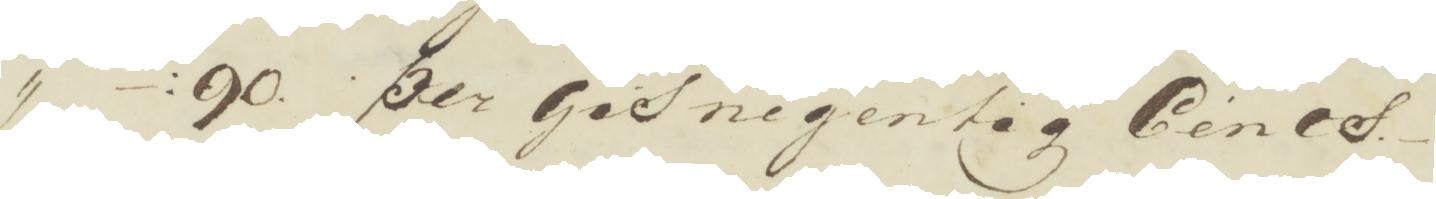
„ —: 90. Per Ges negentig Cents.
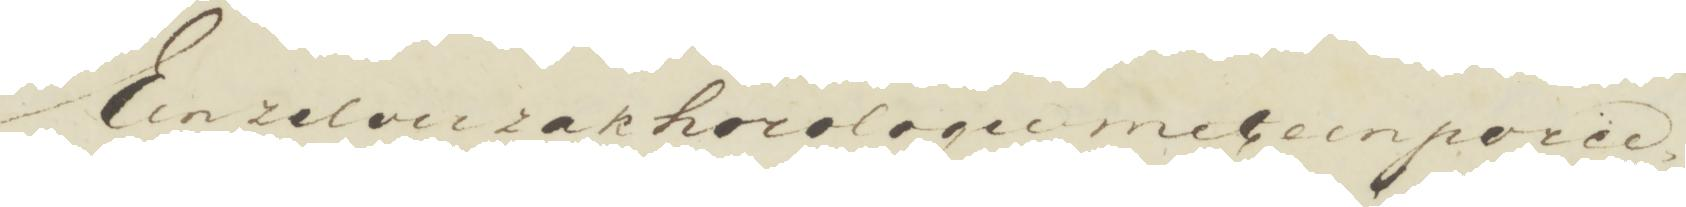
Een zilver zakhorologie met een porce,
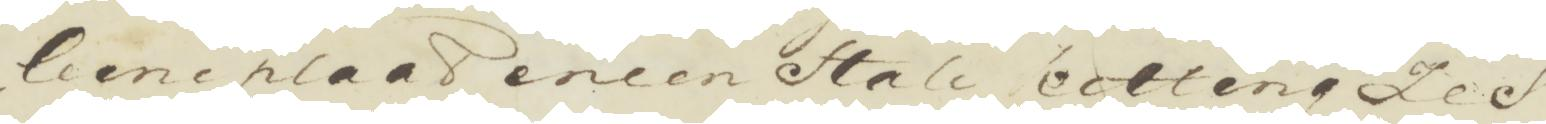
„leene plaat en een stale ketting Zes
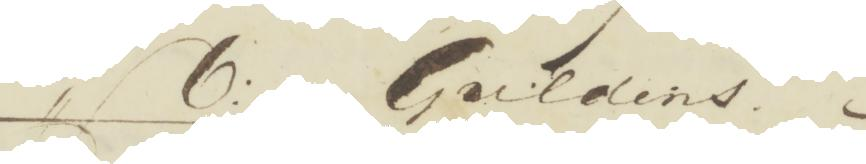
„ 6:„ Guldens.
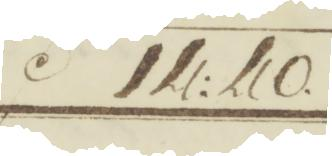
„ ƒ 14:40.
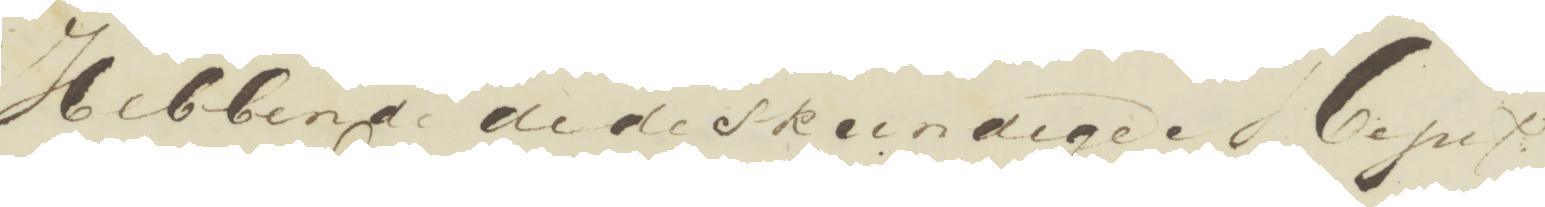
Hebbende de deskundige Mejuf:
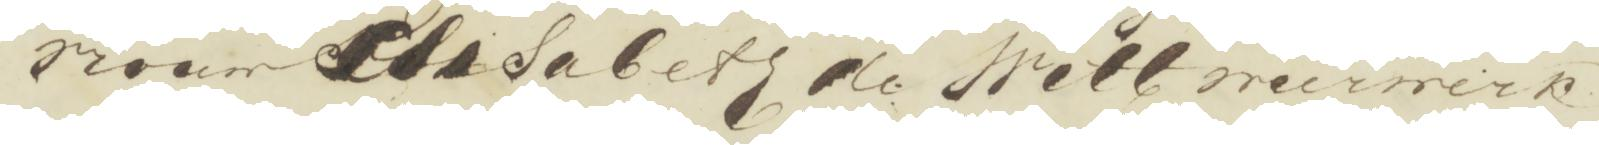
vrouw Elisabeth de Wolf wierwerk:
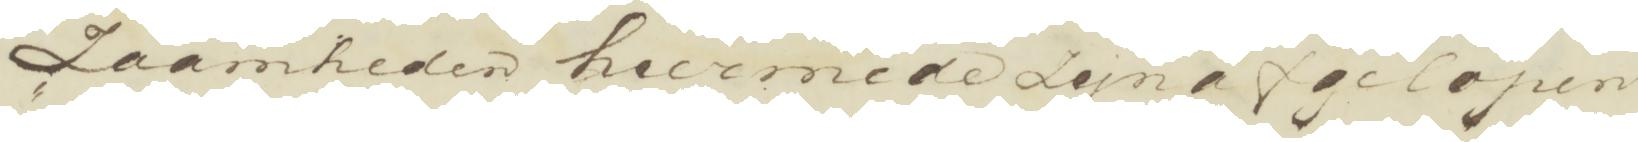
„zaamheden hiermede zijn afgelopen
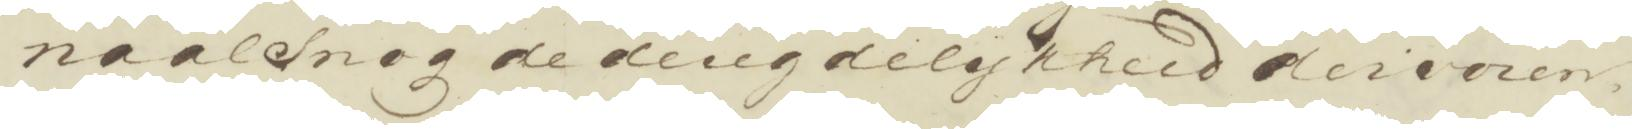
na alsnog de deugdelijkheid der voren
